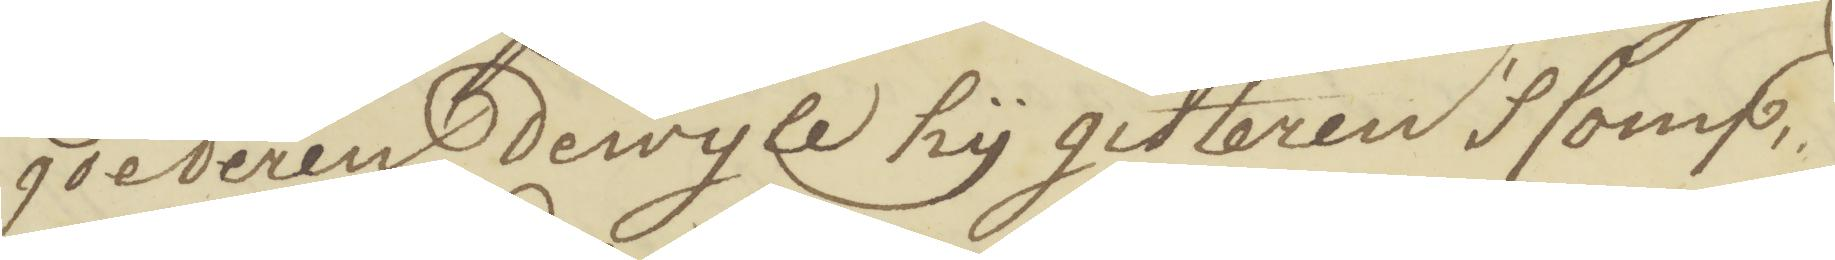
goederen dewijle hij gisteren ’S Comp„s
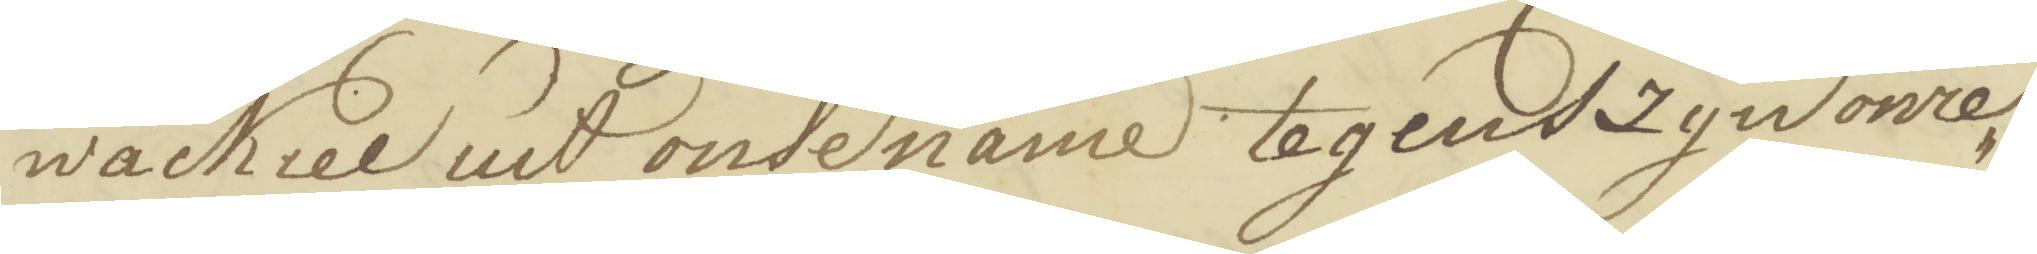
wackiel uit onse name tegens zijn onre„
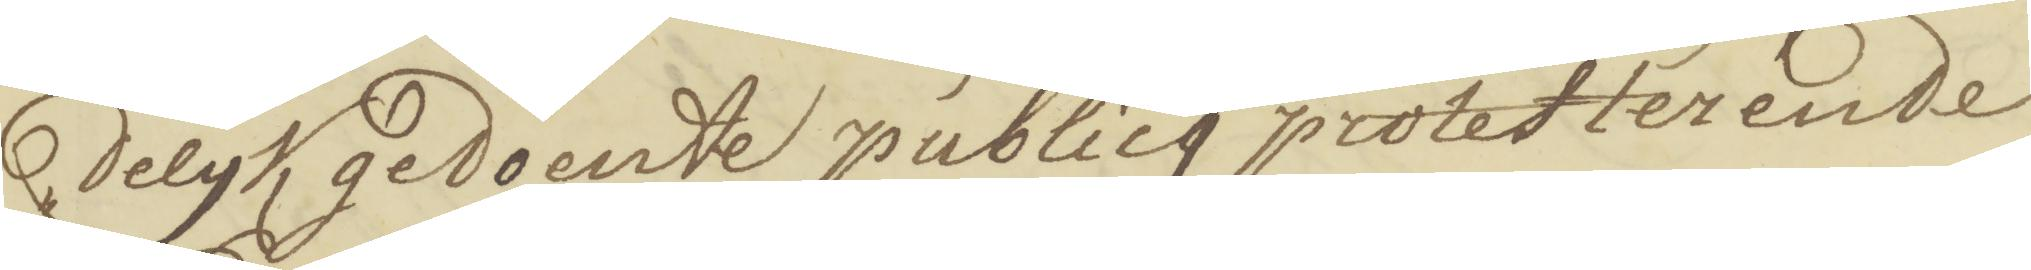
delijk gedoente publicq protesterende
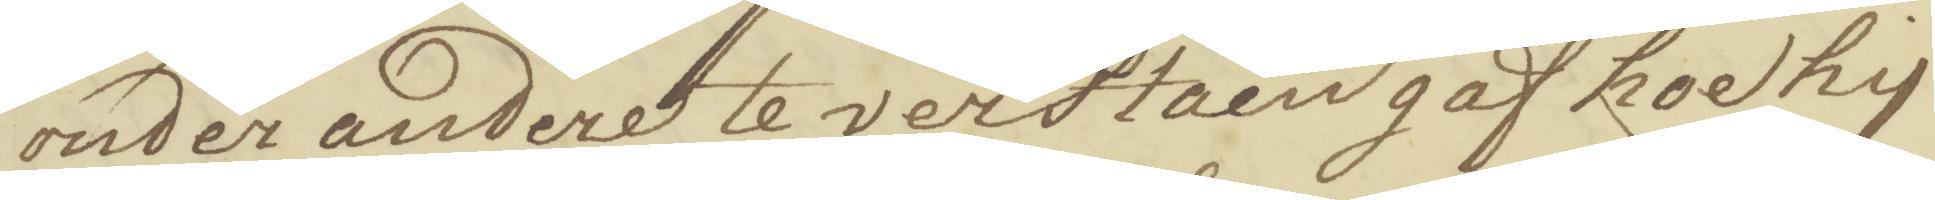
onder andere te verstaen gaf hoe hij
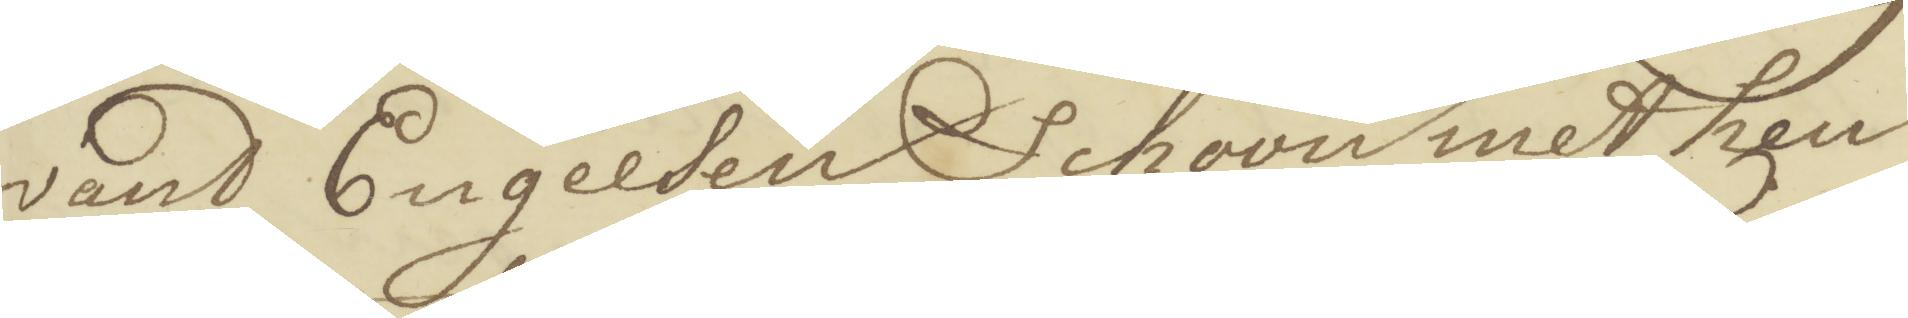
van d' Engelsen Schoon met hen
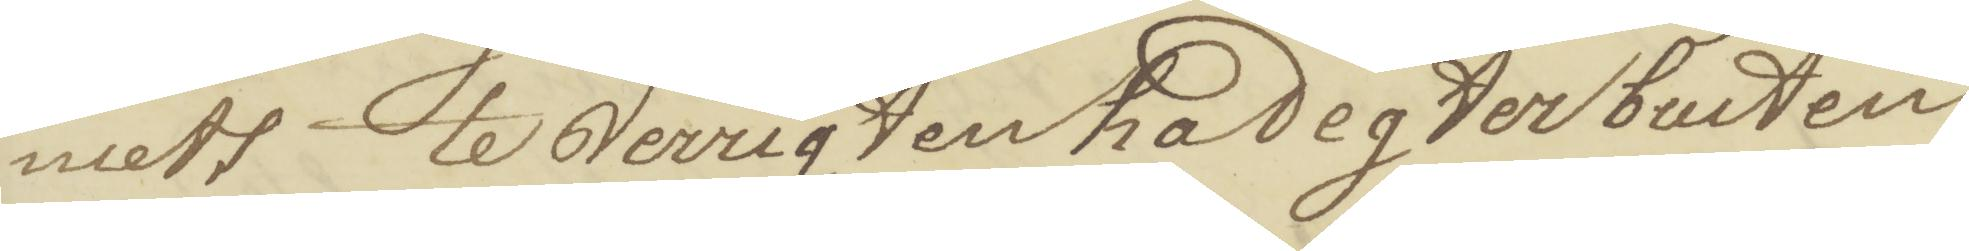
niets te verrigten had egter buiten
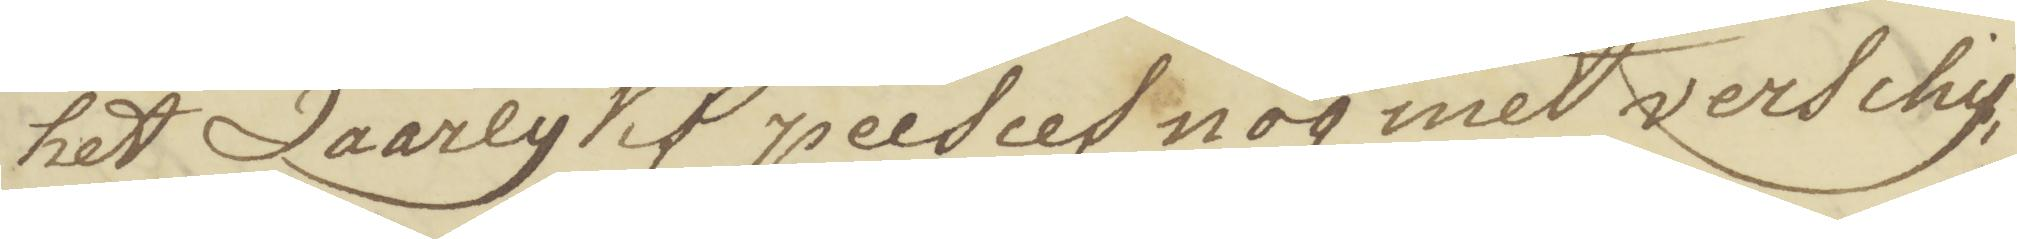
het Iaarljks peesces nog met verschij,
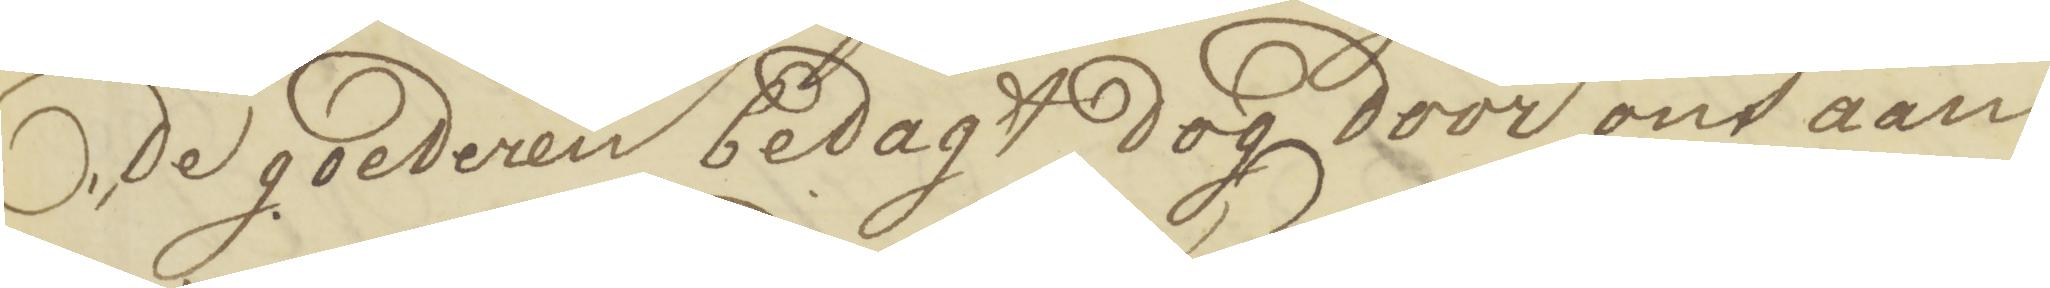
„de goederen bedagt dog door ons aan
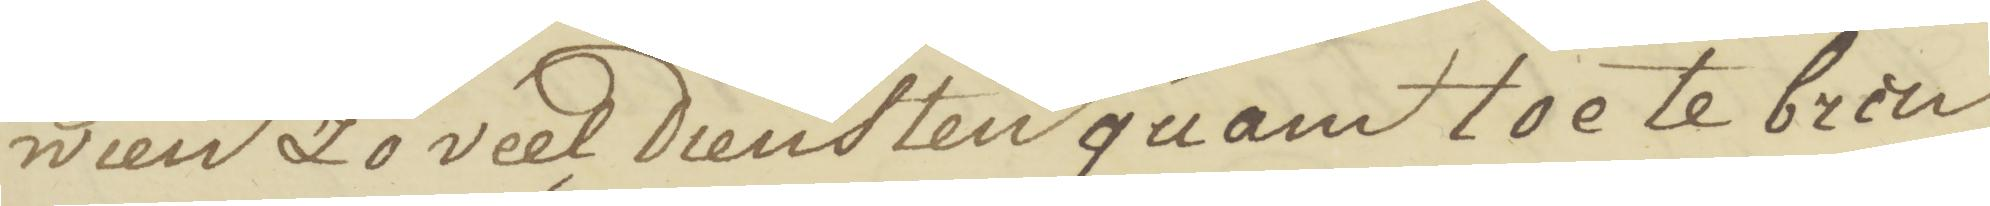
wien zo veel diensten quam toe te bren
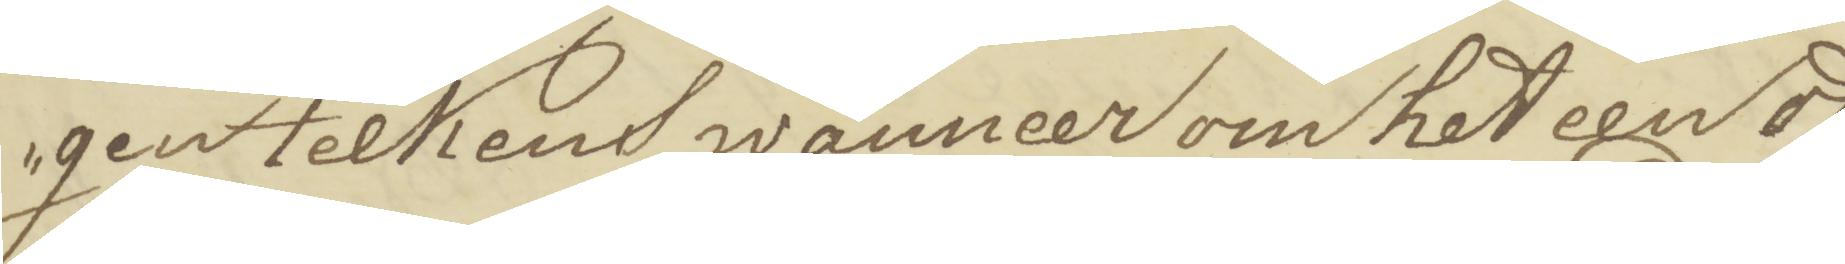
„gen telkens wanneer om het een of
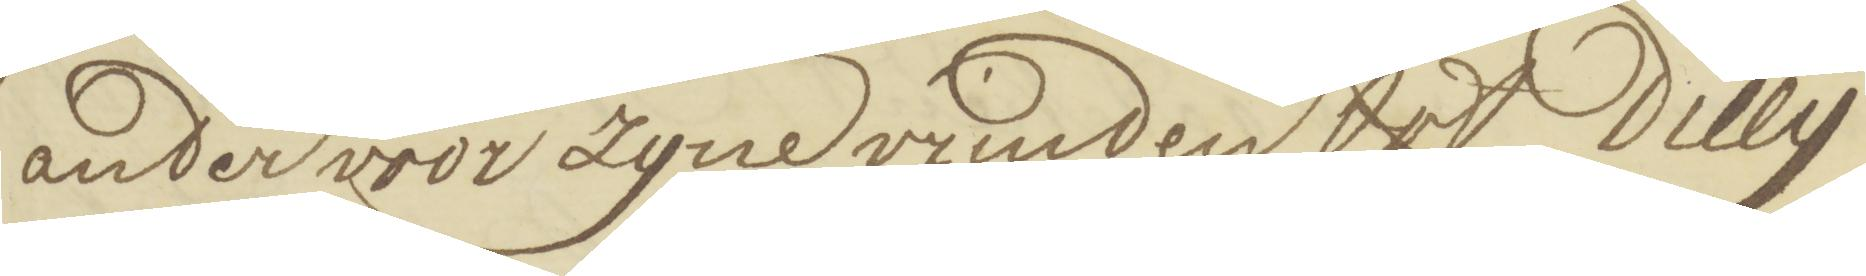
ander voor zijne vrinden dot Dillij
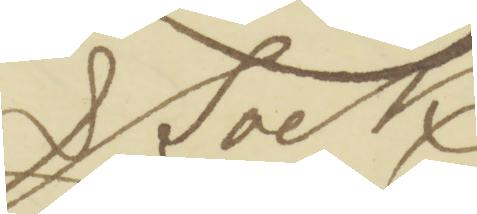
Versoek
